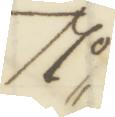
r„o
